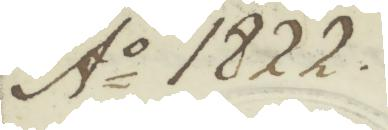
A=o 1822.
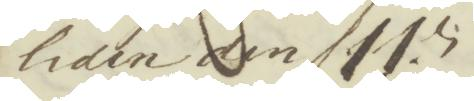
leden den 11.en
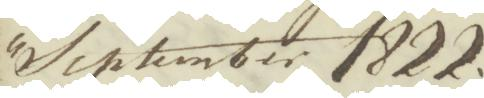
September 1822.
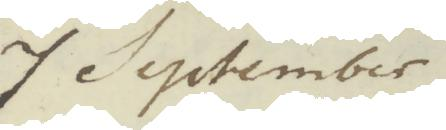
7 September
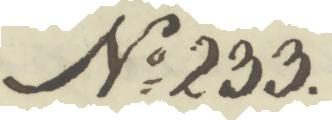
N=o 233.
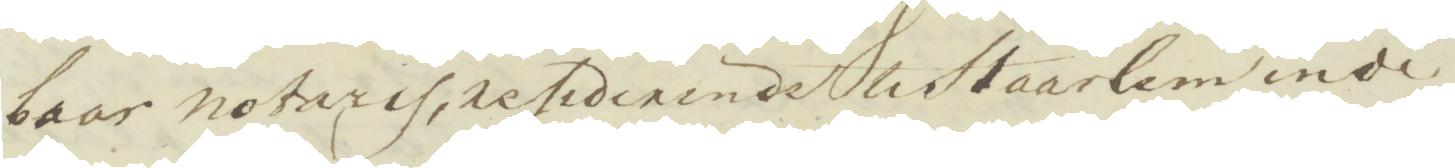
baar notaris, residerende te Haarlem in de
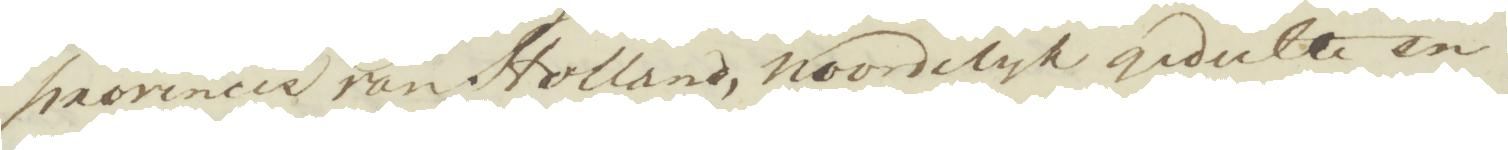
provincie van Holland, noordelyk gedeelte en
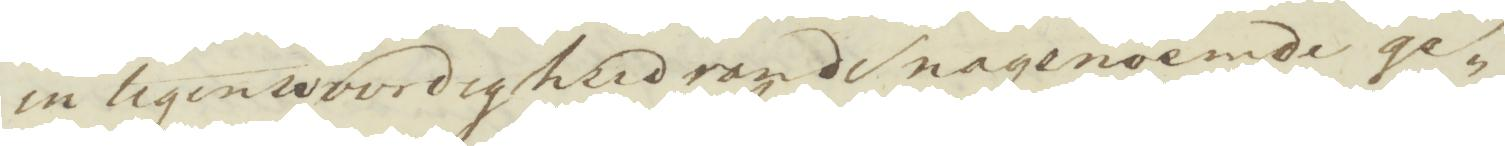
in tegenwoordigheid van de nagenoemde ge„
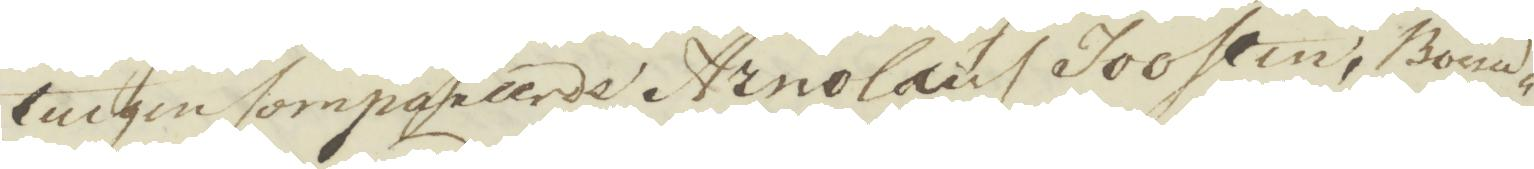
tuigen Compareerde Arnoldus Joosten, Bouw„
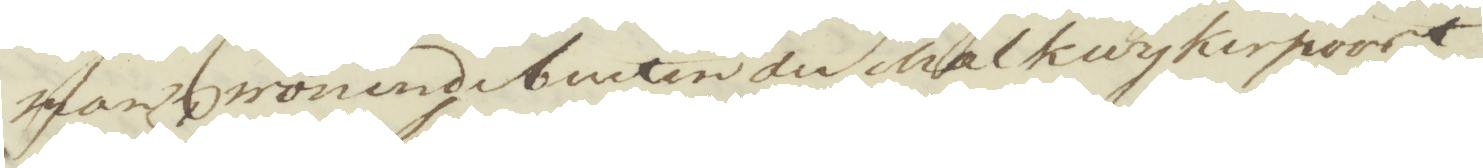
man, wonende buiten de Schalkwykerpoort
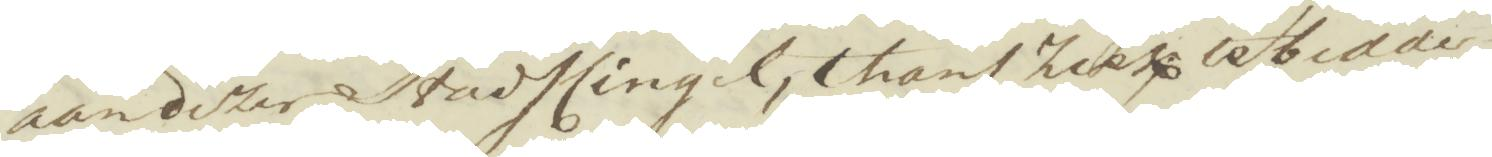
aan dezer Stadssingel, thans zich te bedde
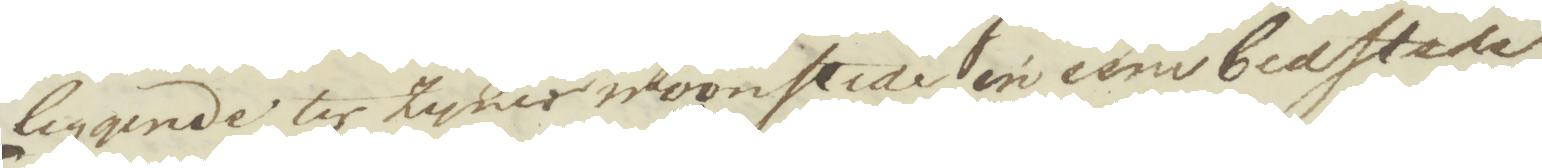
liggende ter zyner woonstede in eene bedstede
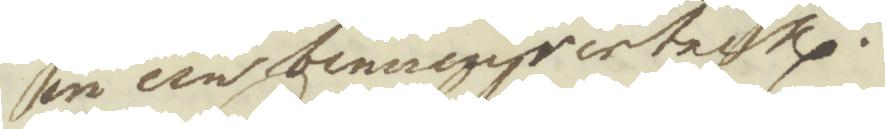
in een binnenvertrek.
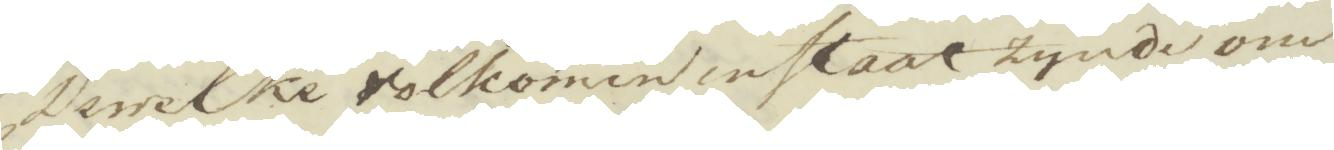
Dewelke volkomen in staat zynde om
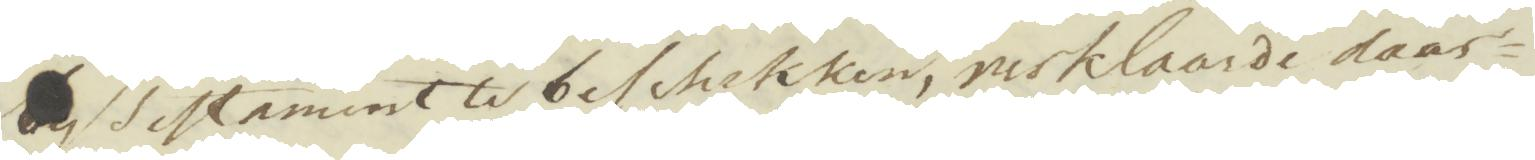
by Testament te beschikken, verklaarde daar=
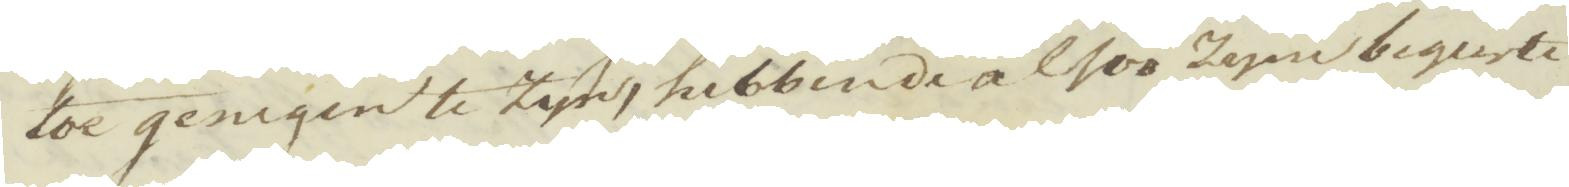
toe genegen te zyn, hebbende alsoo zyne begeerte
